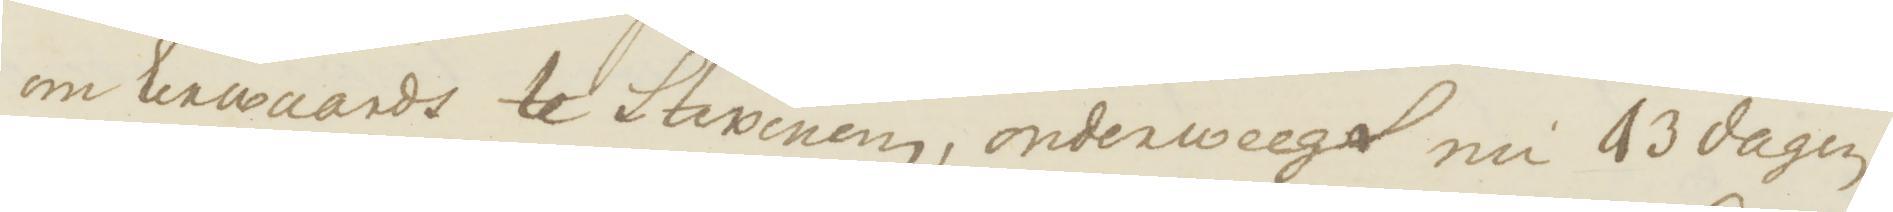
om herwaards te stevenen, onderweegs nu 43 dagen
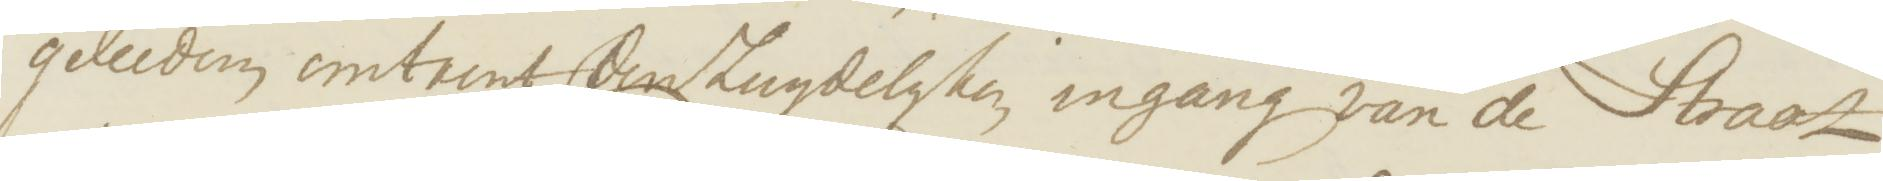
geleeden omtrent den Zuydelyken ingang van de Straat
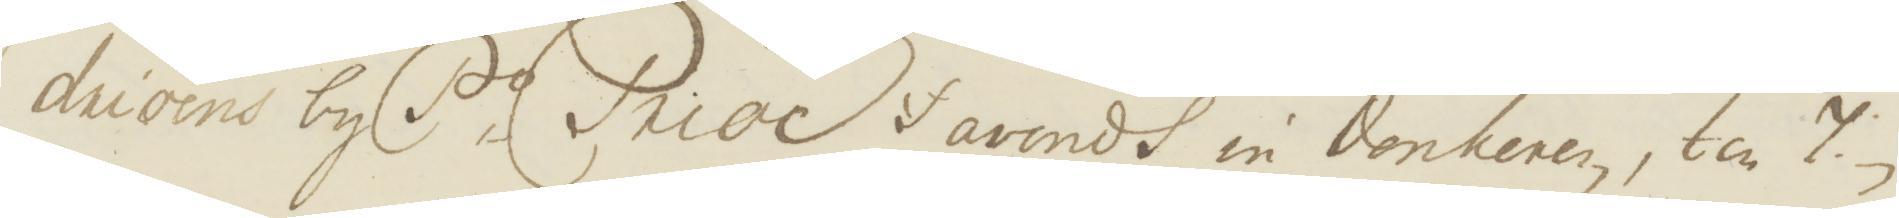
drioens bij P„o Prioe 's avonds en donkeren, ten 7.,
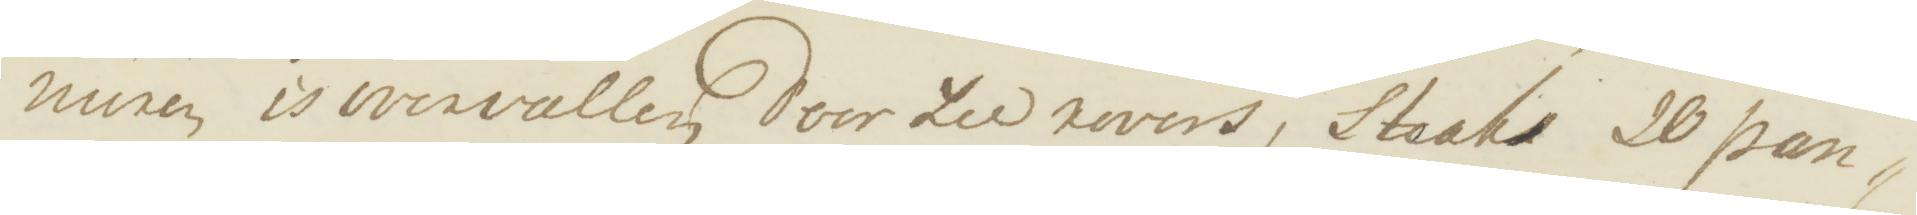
uuren is overvallen door zee rovers, stuks 20 pan„
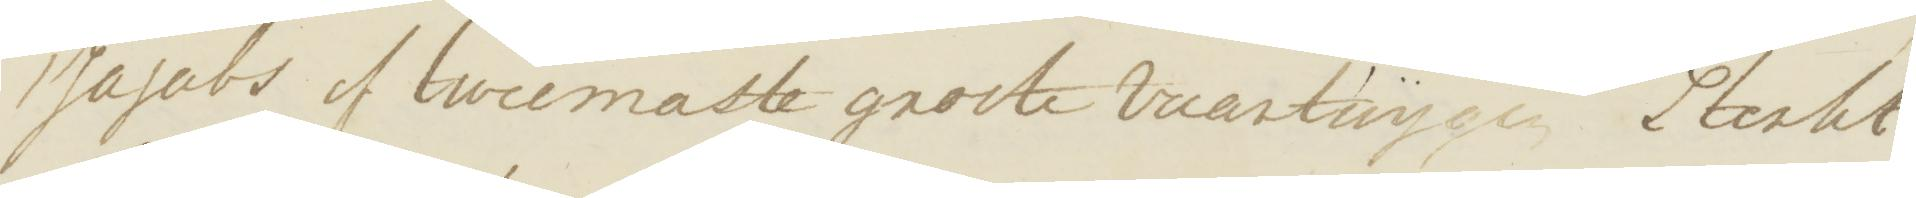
,Jajabs of tweemaste groote vaartuijgen Sterkt
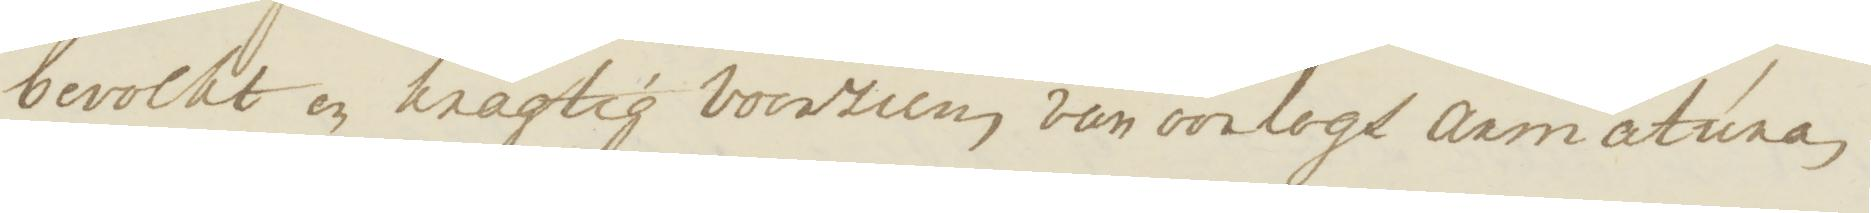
bevolkt en kragtig voorzien van oorlogs armatura
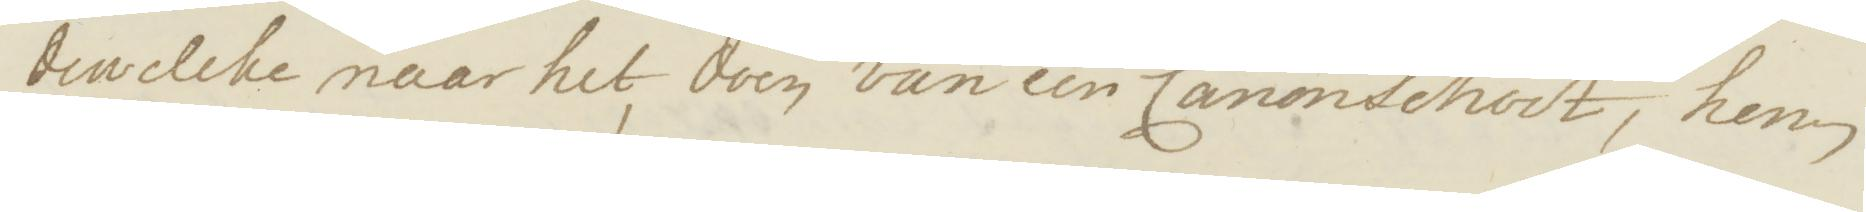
dewelcke naar het doen van een Canonschoot, hem
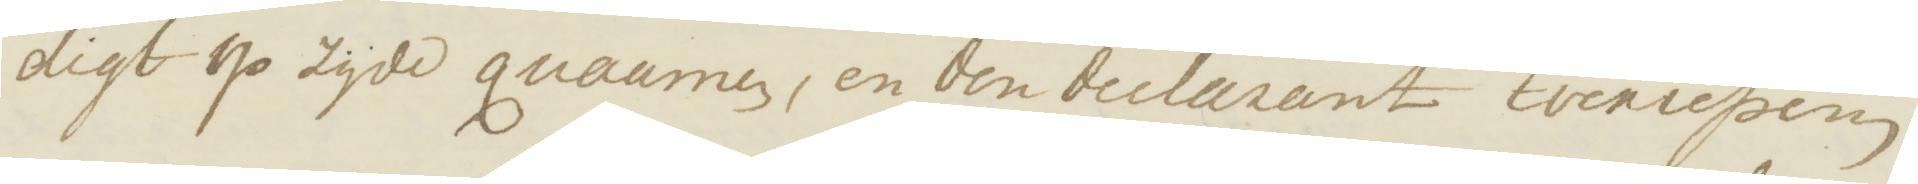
digt op zijde quaamen, en den declarant toeriepen
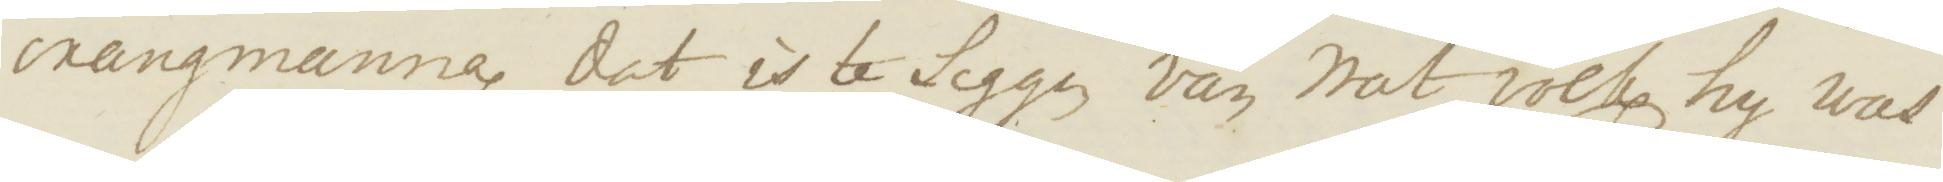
orangmanna dat is te seggen van wat volk hy was
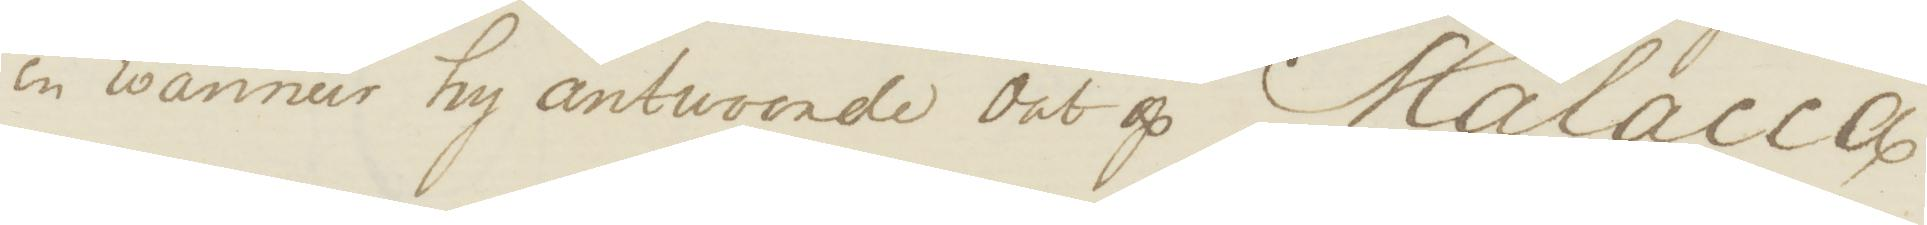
en wanneer hy antwoorde dat op Malacca
